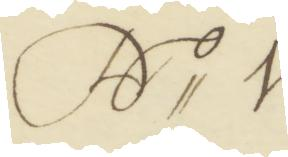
N„o 1
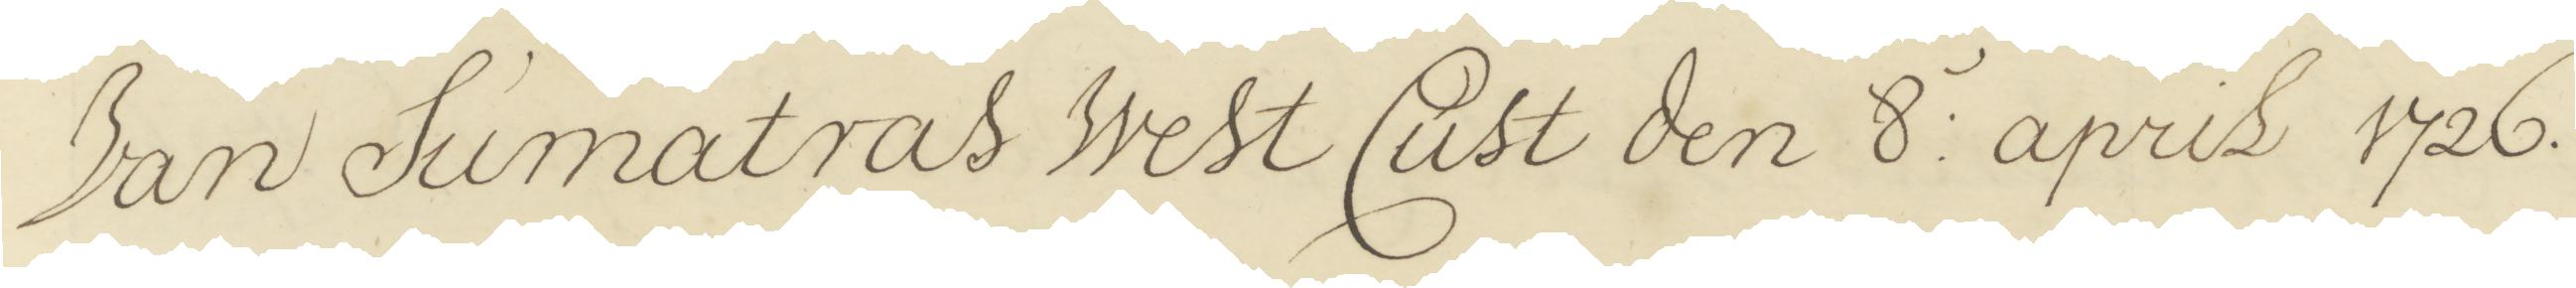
Van Sumatras West Cust den 8:' april 1726.
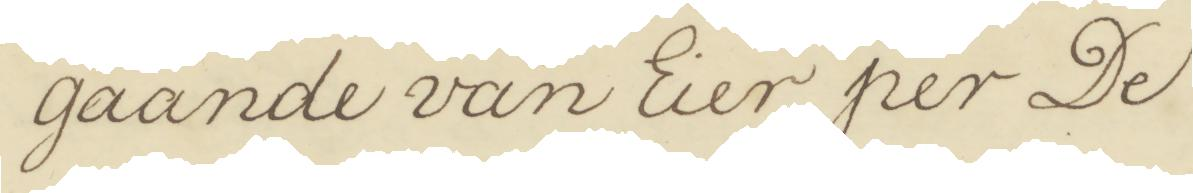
gaande van hier per De
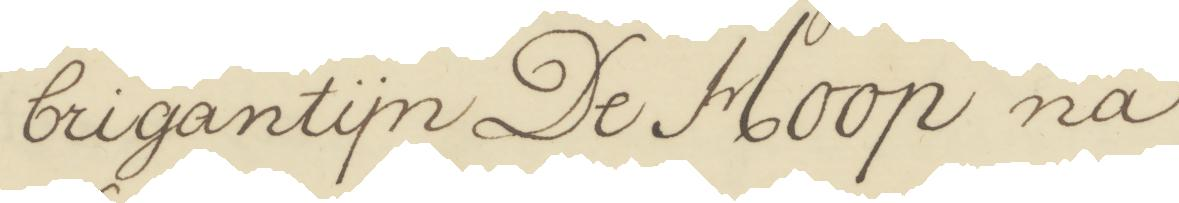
brigantijn De Hoop na
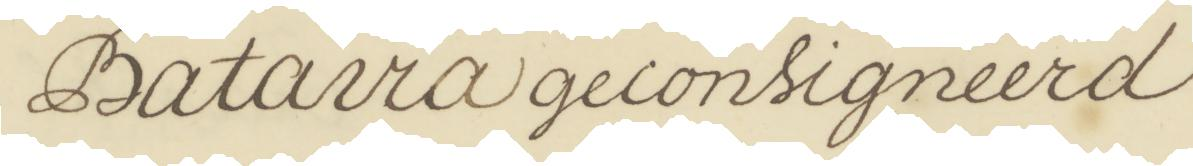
Batavia geconsigneerd
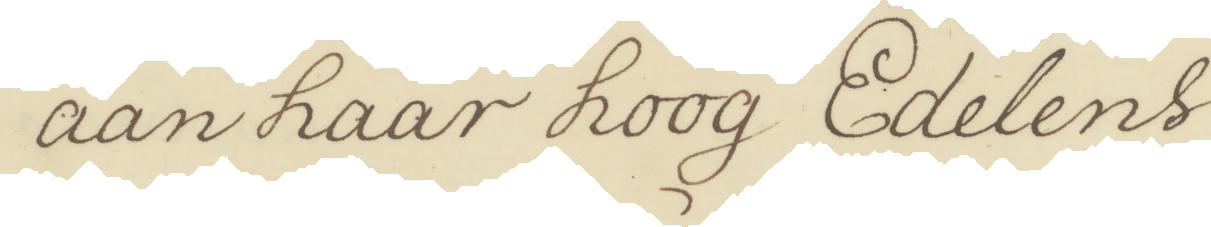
aan haar hoog Edelens
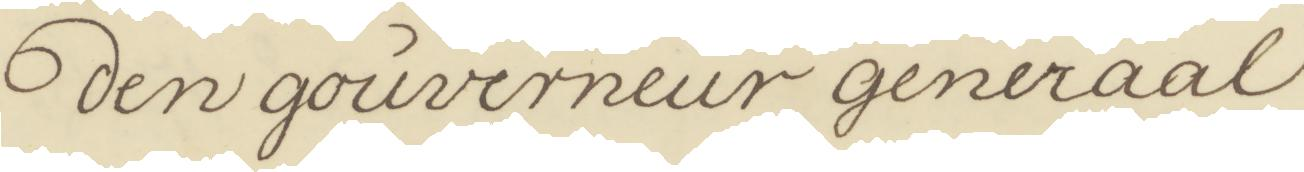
den gouverneur generaal
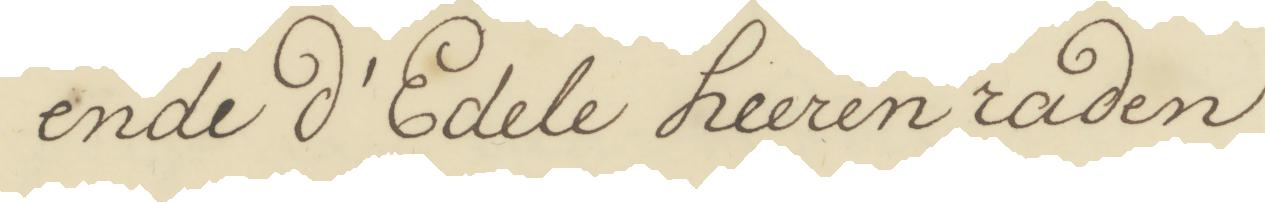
ende d’ Edele heeren raden
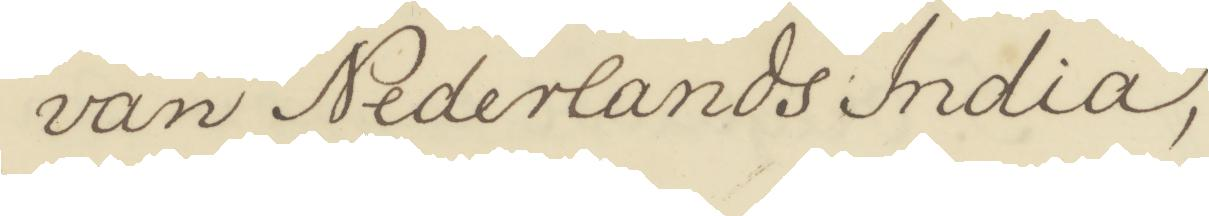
van Nederlands India,
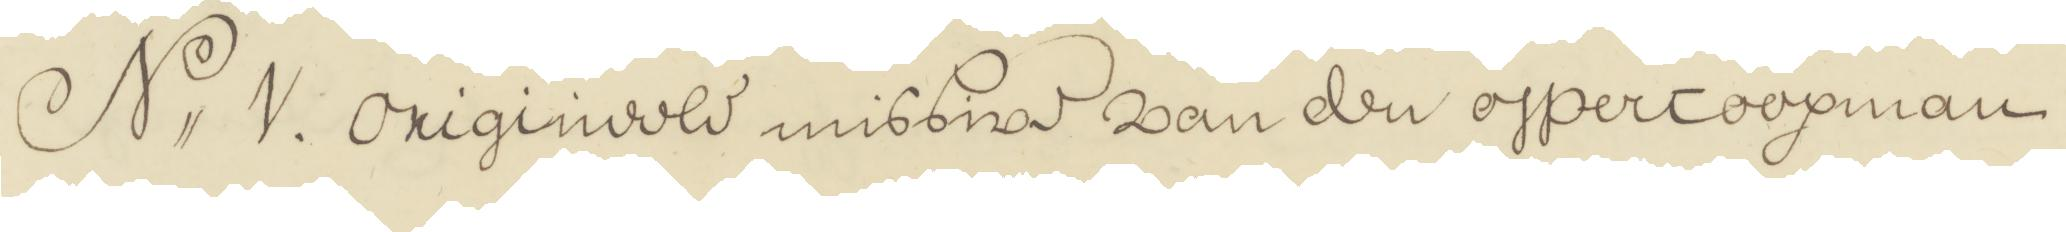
N„o 1: Origineele missive van den oppercoopman
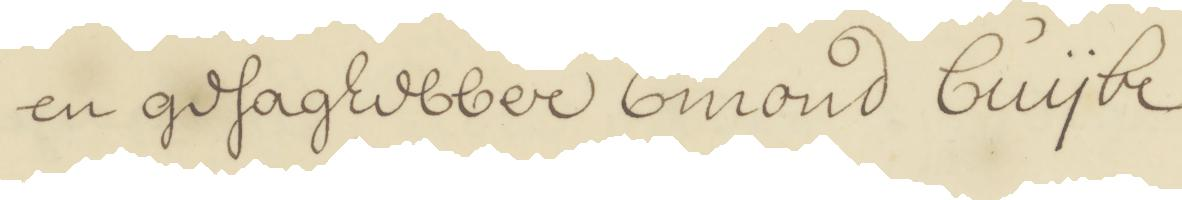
en gesaghebber Emond buijk
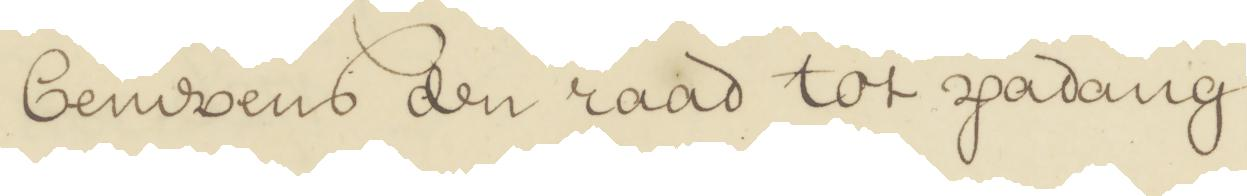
benevens den raad tot padang
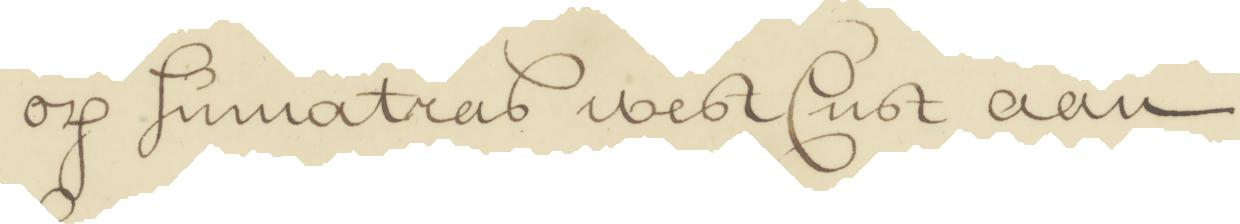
op sumatras west cust aan
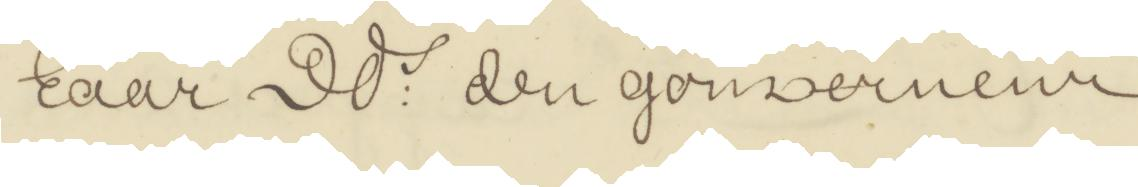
haar Ed:s den gouverneur
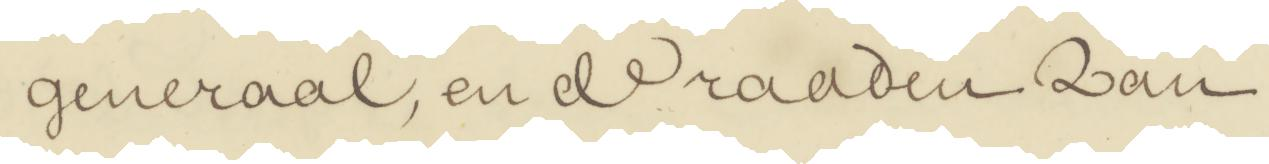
generaal, en de raaden van
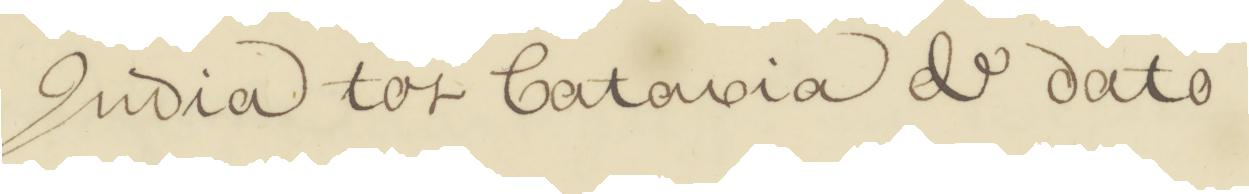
India tot batavia de dato
